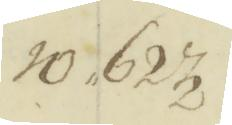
10„62½
